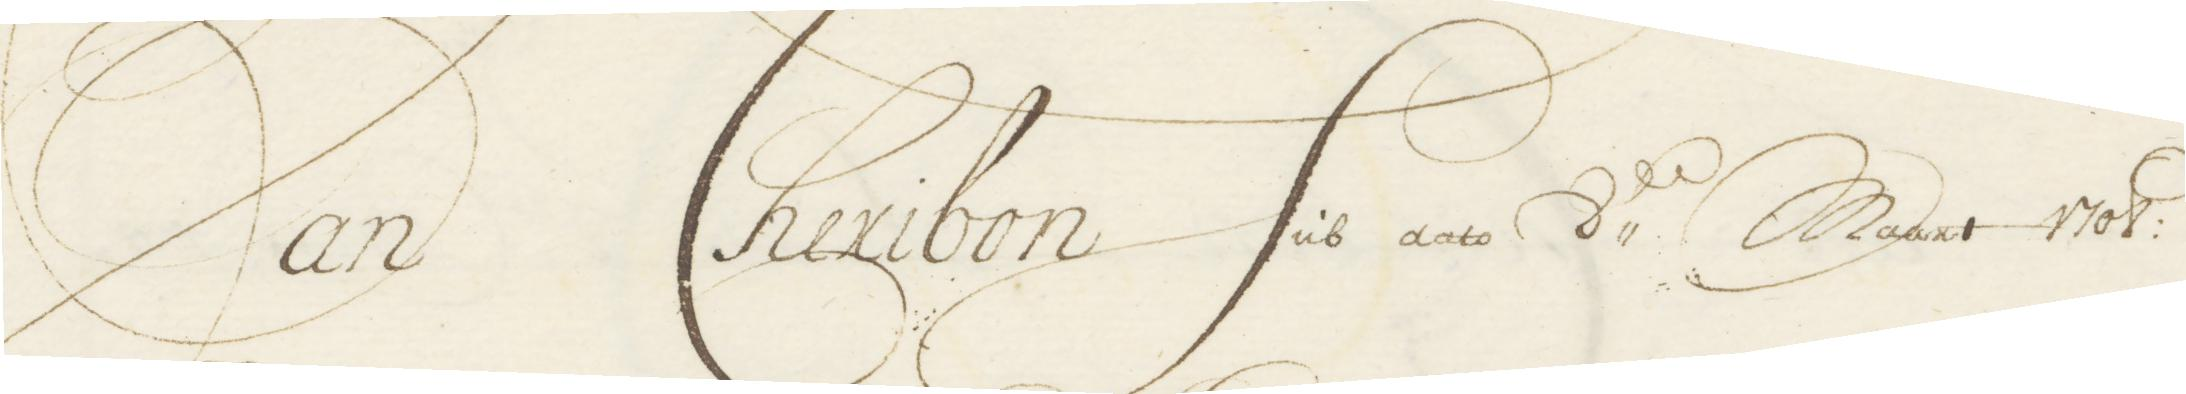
Van Cheribon Sub dato 8„e Maart 1708:
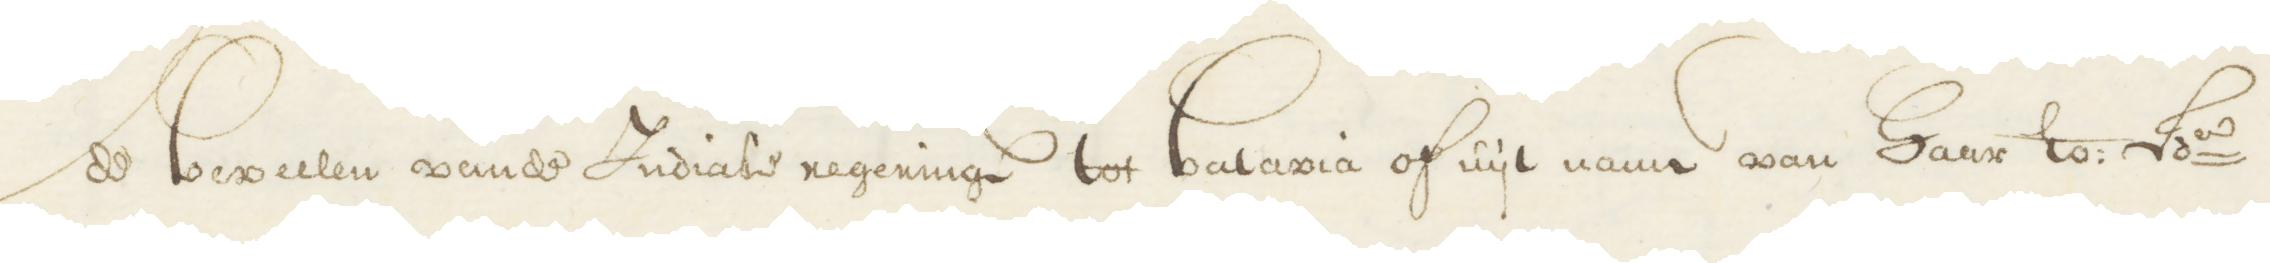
de beveelen van de Indiase regeringe tot batavia of uijt name van haar ho: Ed=le
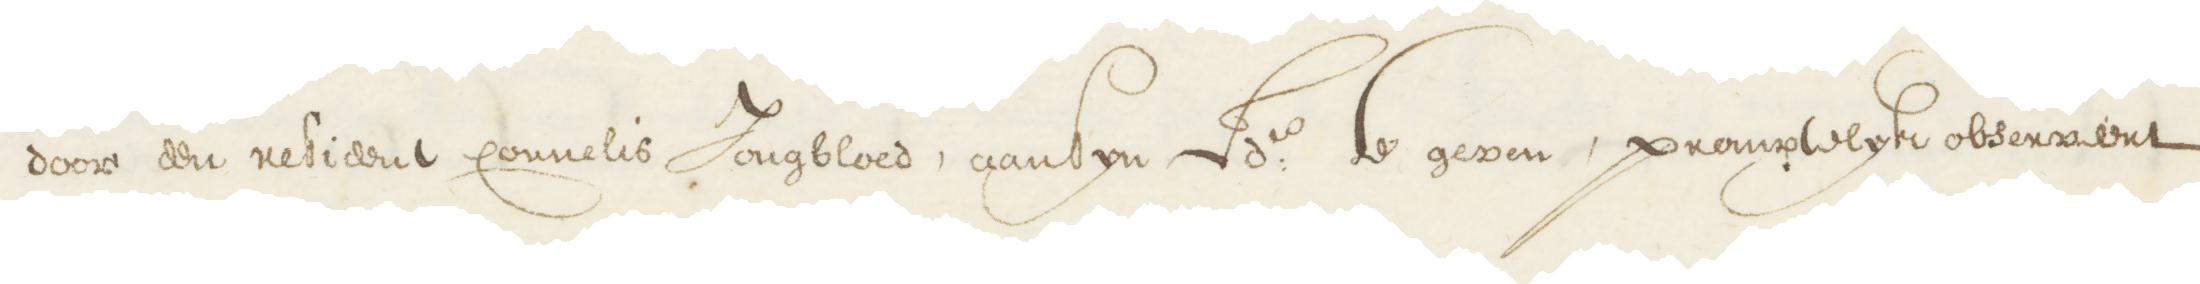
door den resident Cornelis Iongbloed, aansyn Ed:le te geven, promptelyk observeert
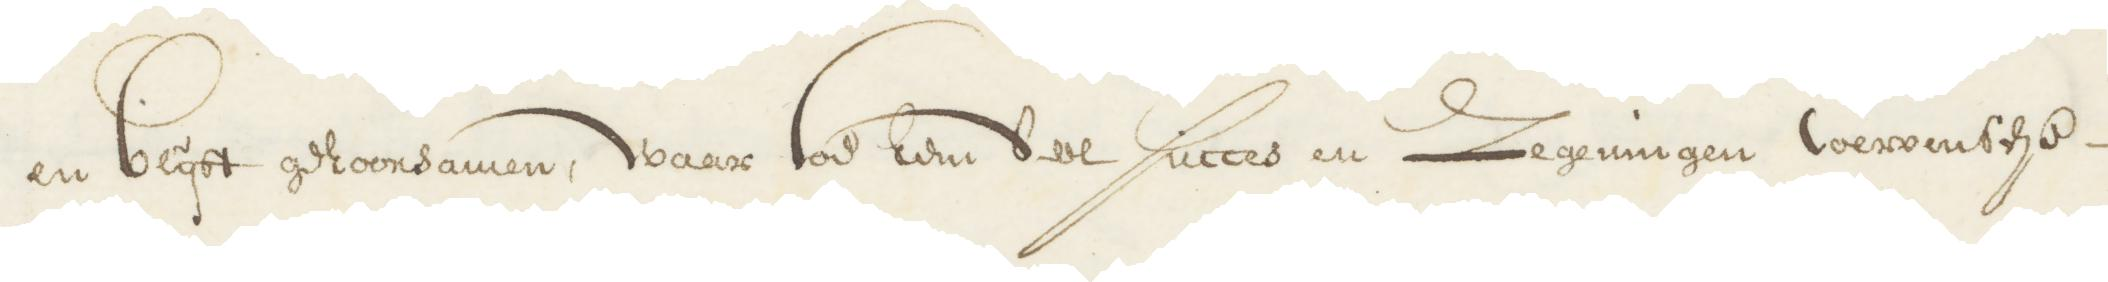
en blijst gehoorsamen, waar toe hem veel succes en Zegeningen toewensche
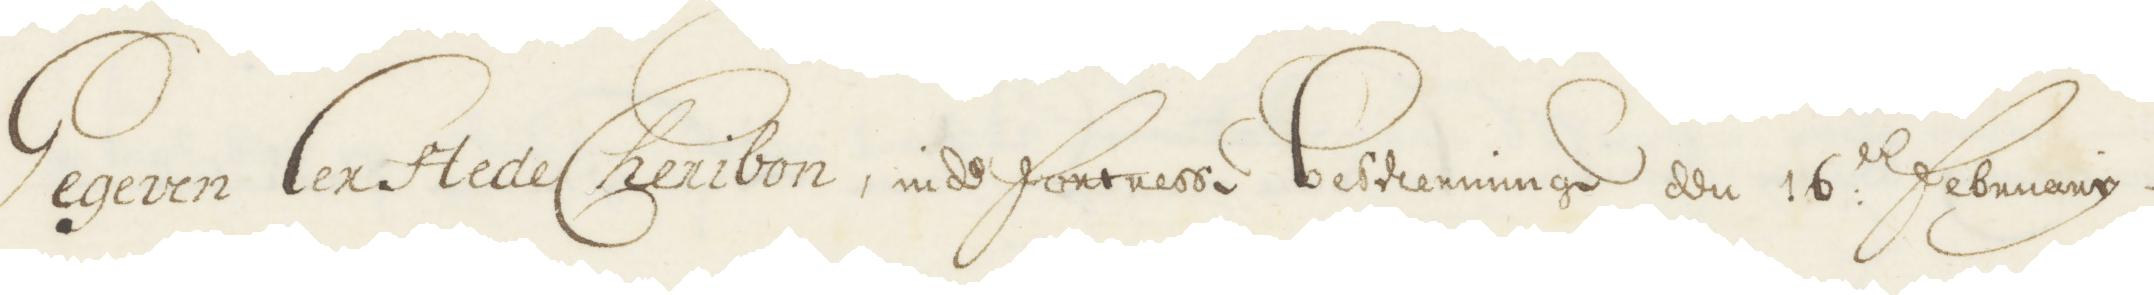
Gegeven ter stede Cheribon, in de fortresse bescherminge den 16:e februarij
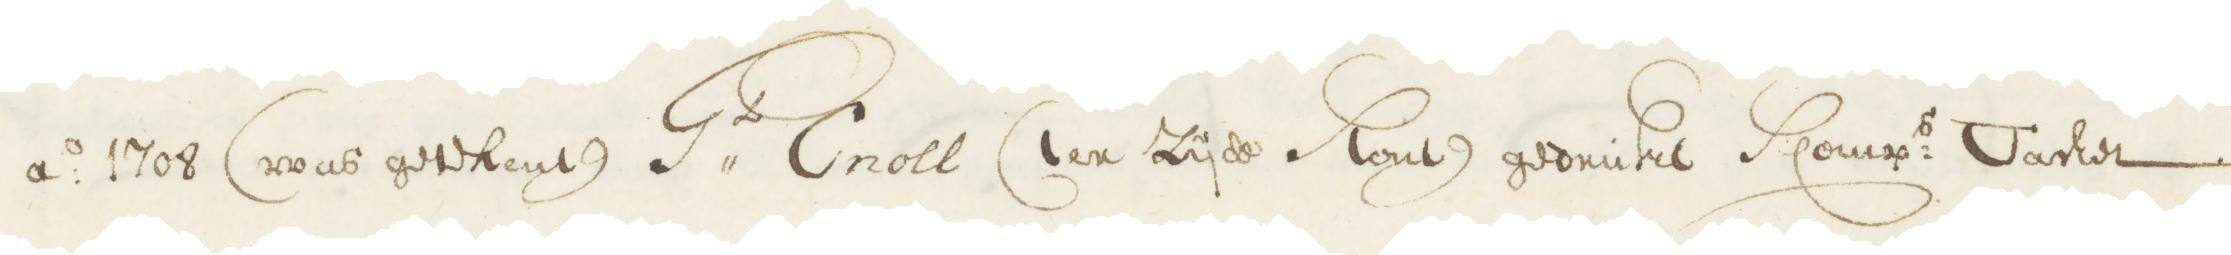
a:o 1708 (was getekent) G„t Cnoll (ter zijde stont) gedruckt S:Comp:s Cachet
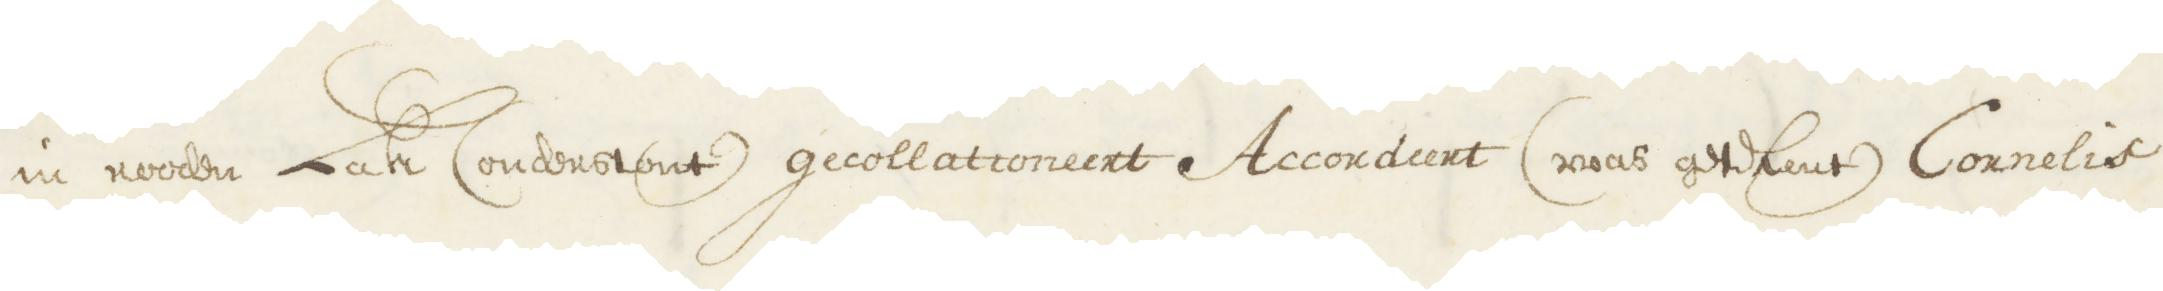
in rooden zak (onderstont) gecollationeert Accordeert (was getekent) Cornelis
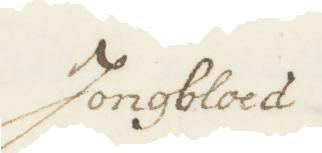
Jongbloed
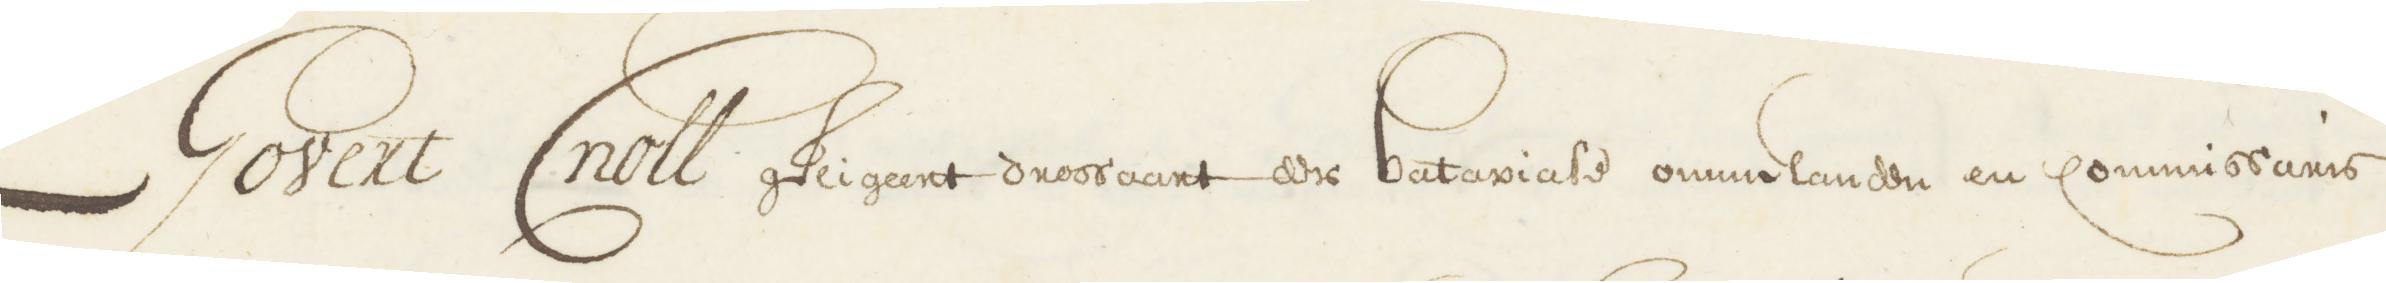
Govert Cnoll gEeigeert drossaart den bataviase ommelanden en Commissaris
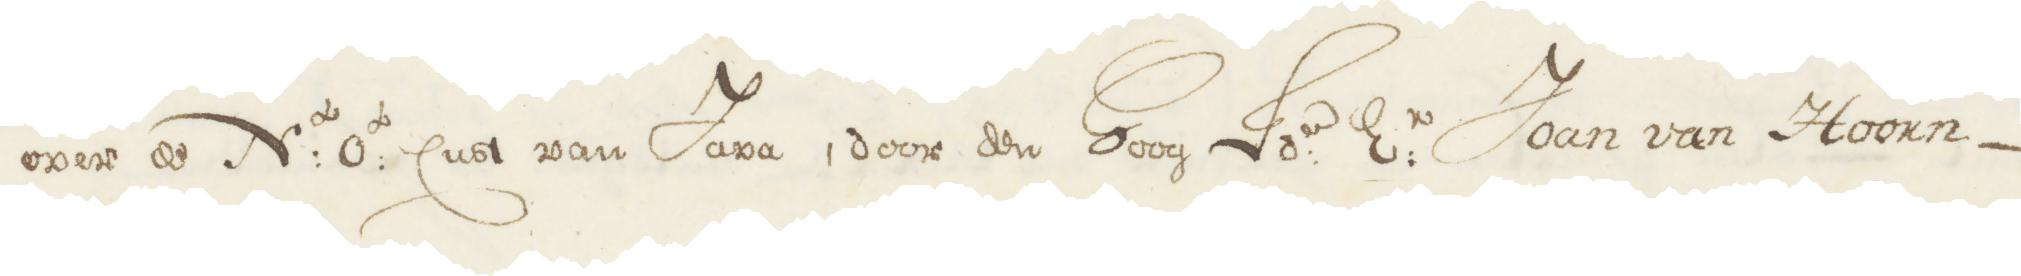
over de N:t O:t Cust van Java, door den Hoog Ed:le h:r Ioan van Hoorn
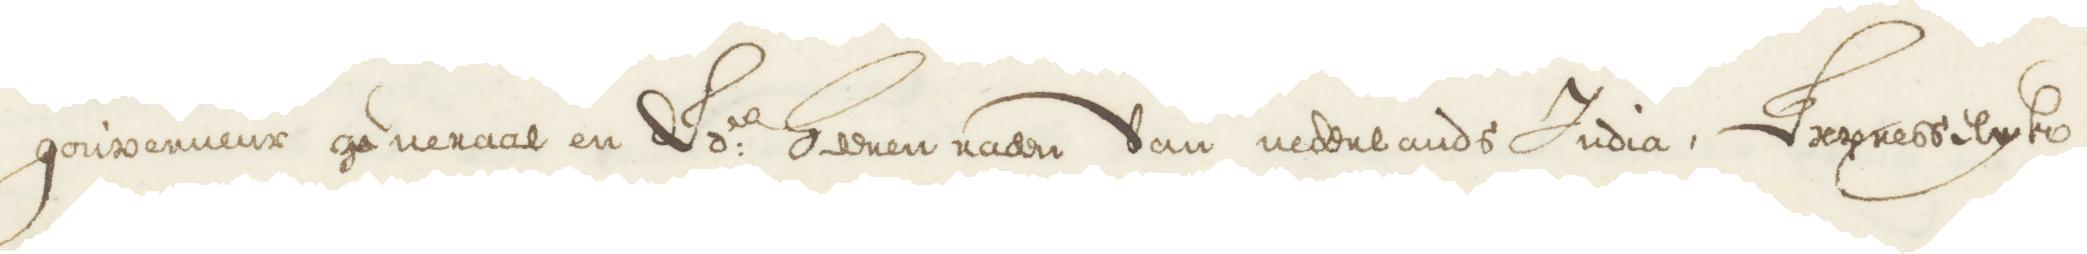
gouverneur generaal en Ed:le heeren raden van nederlands India, Expresselyk
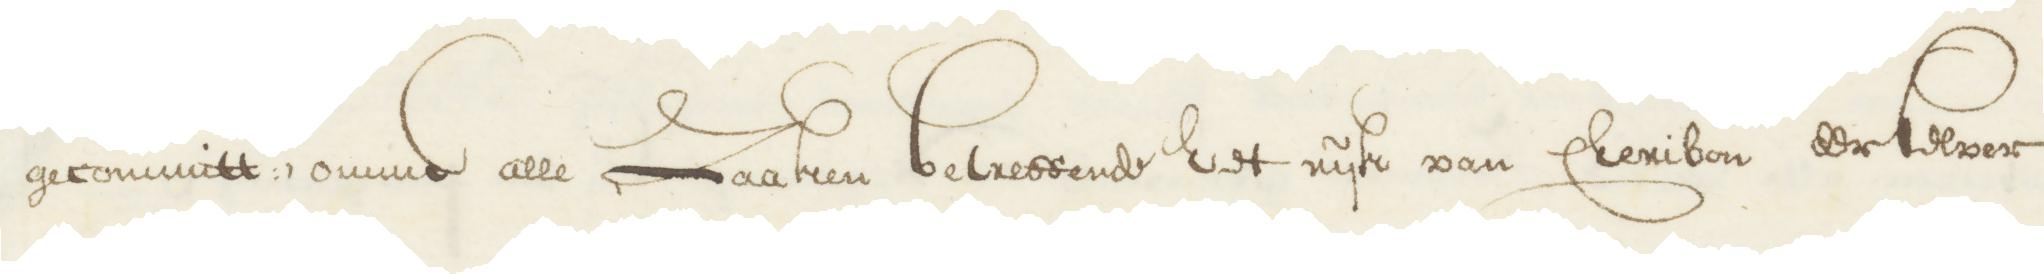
gecommitt:t, omme alle Zaaken betreffende het rijk van Cheribon derselver
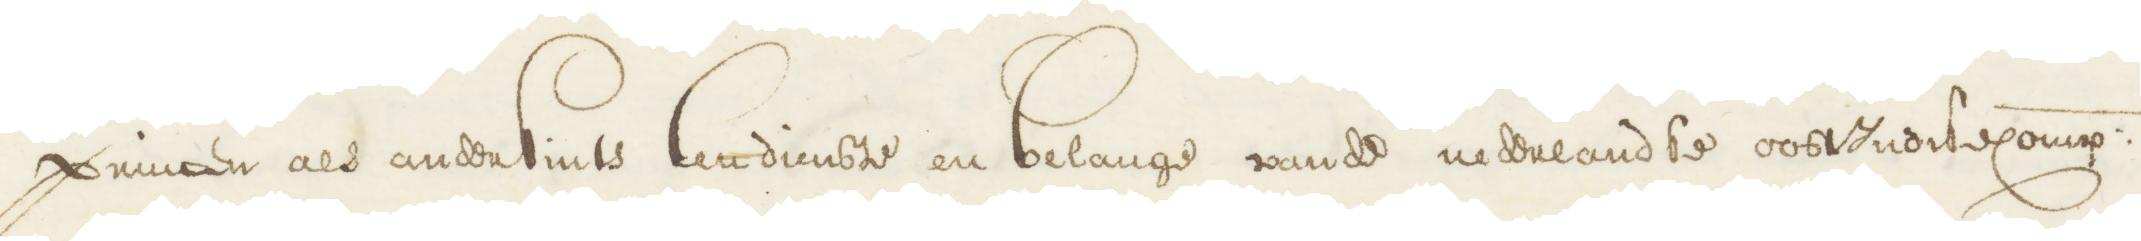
princen als andersints ten dienste en belange van de nederlandse oost Indise Comp:
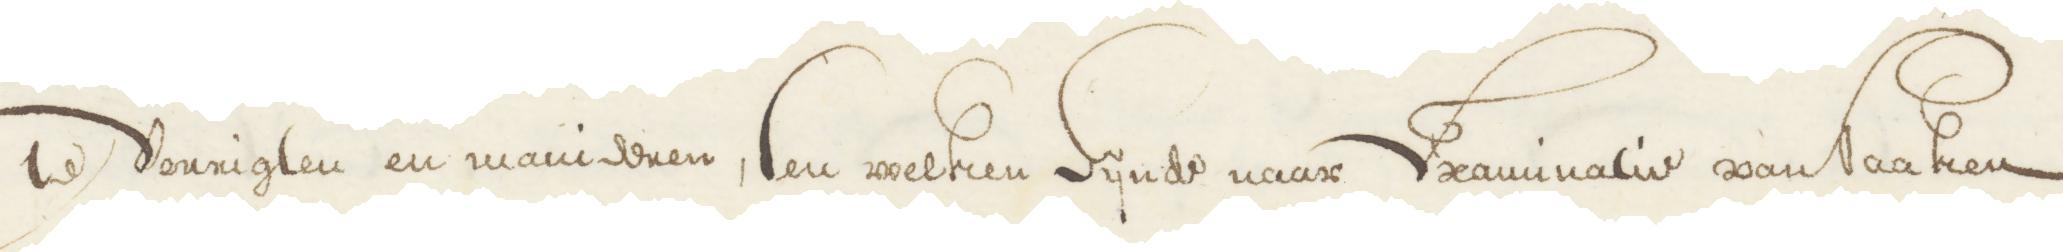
te verrigten en manieeren, ten welken Eijnde naar Examinatie van saaken
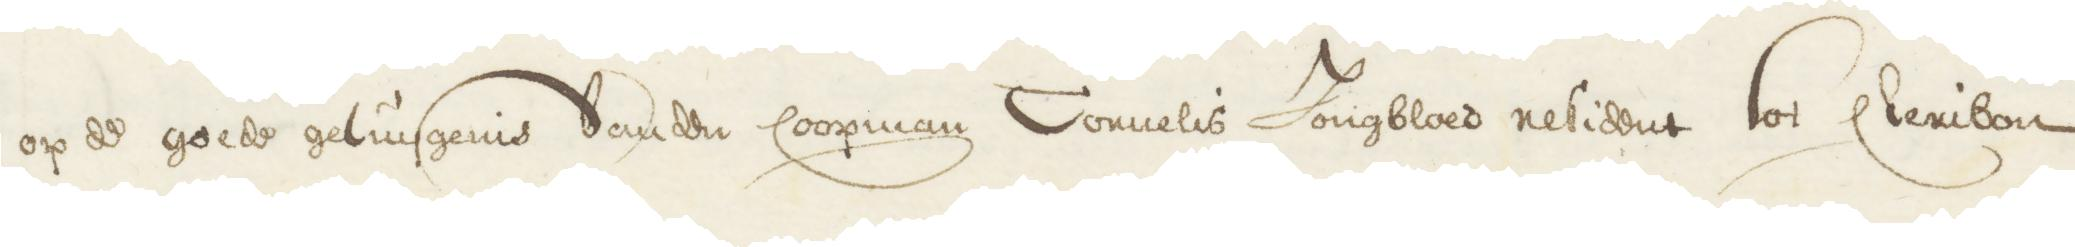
op de goede getuygenis van den Coopman Cornelis Iongbloed resident tot Cheribon
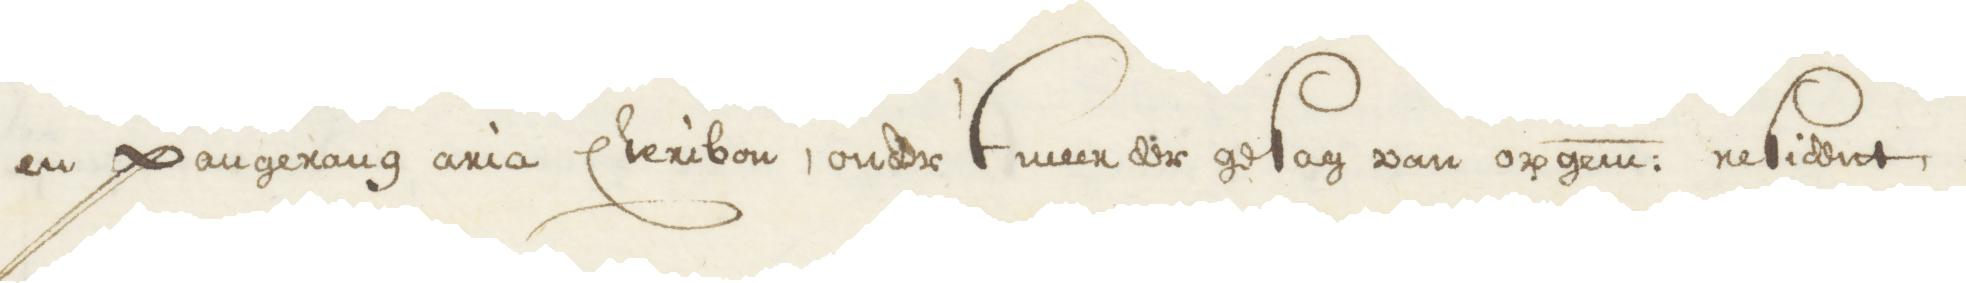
en pangerang aria Cheribon, onder ’t meer der gesag van opgem: resident,
